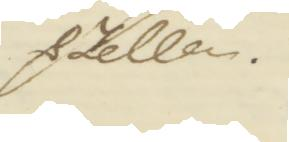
verzellen.
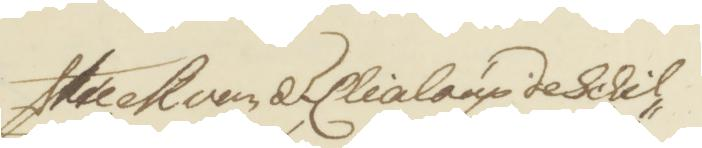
vertreck van de Chialoup de schil„
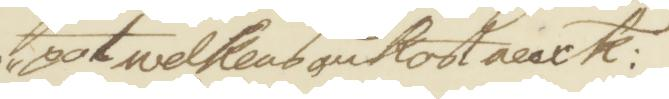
„pot welkers onkost reeck:
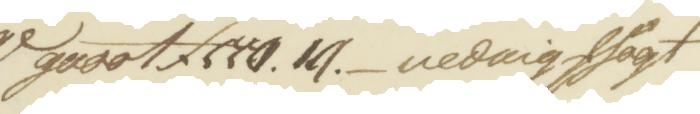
groot ƒ554.14. — nedrig versogt
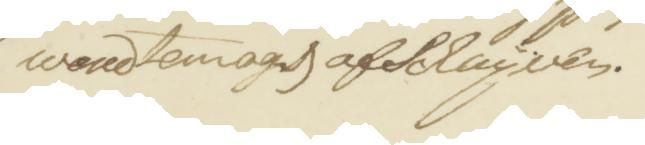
werd te mogen afschrijven.
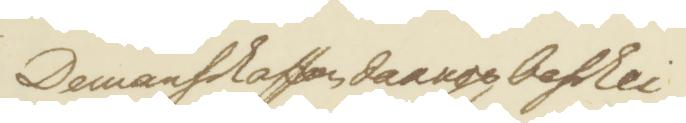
De manschappen daarop beschei
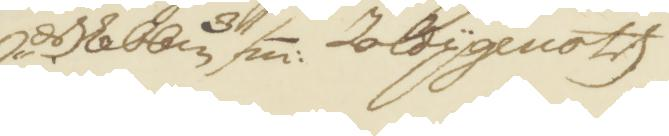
den hebben 3/m: zoldij genoten
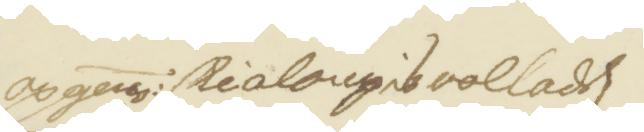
opgem: Chialoup is volladen
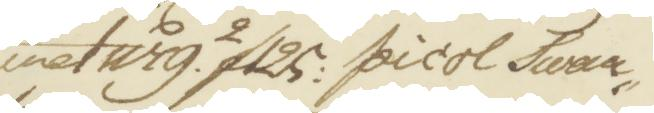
met 1179. 2f125. picol swar„
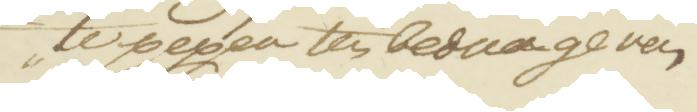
„te peper ten bedrage van
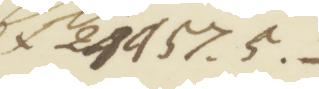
ƒ29457. 5.
